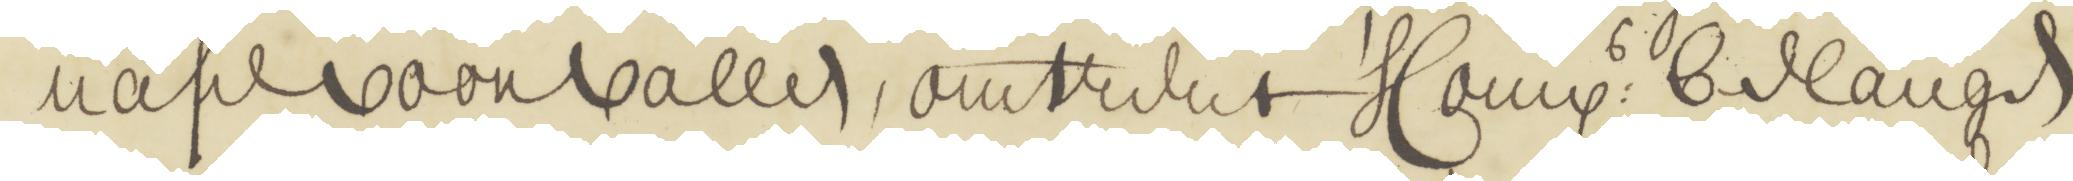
nase voorvallen, omtrent 's Comp:s belangen
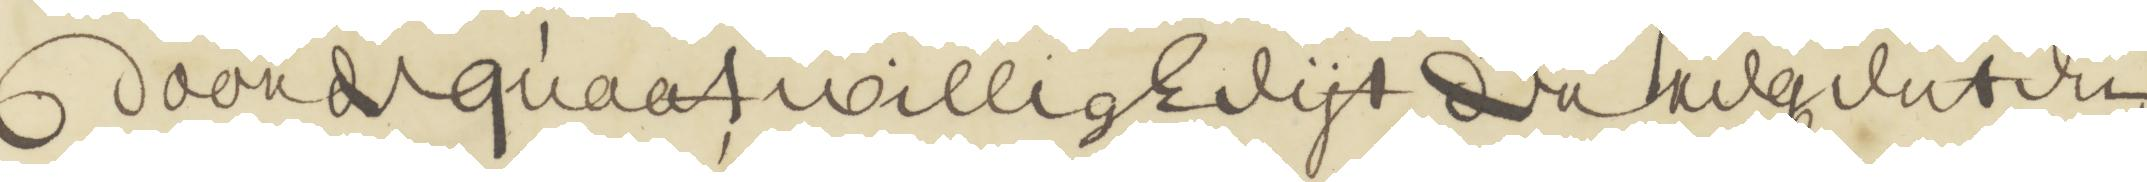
door de quaatwilligheijt der regenten
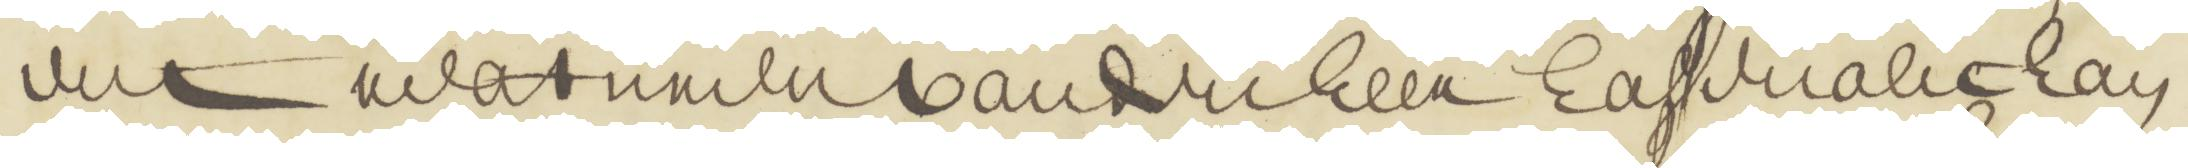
en creaturen van den heer hassenalichan
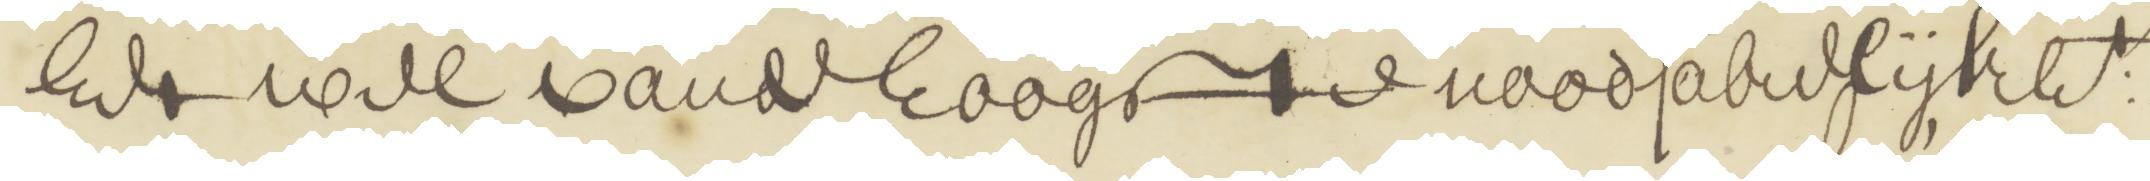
het wel vande hoogste noodsakelijkh:t
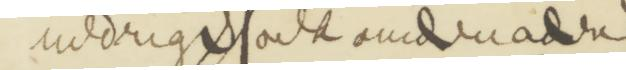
nedrig versoek om de nader
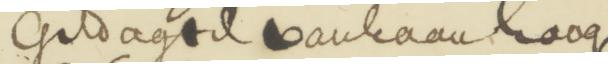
Gedagte van haar hoog
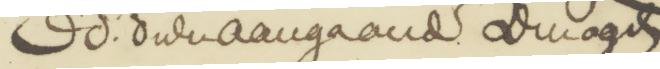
Ed:s dienaangaande te mogen
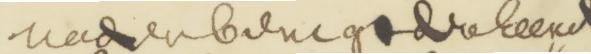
nader berigt der heeren
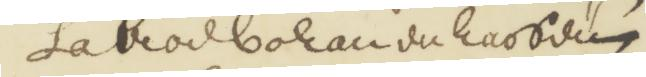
takoebohan en hassen
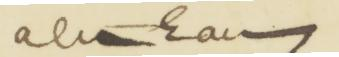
alichan
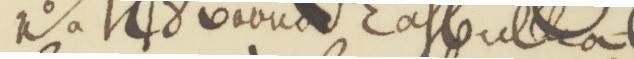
r o/a 148 voor de hasbulha
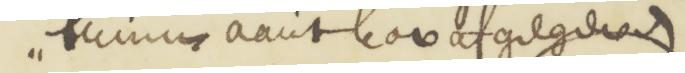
„bium aan 't hov afgegeven
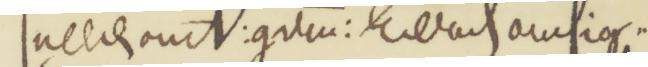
sullen omt:t gem: heeren omsig„
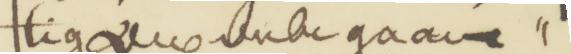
tig tewerk gaan
